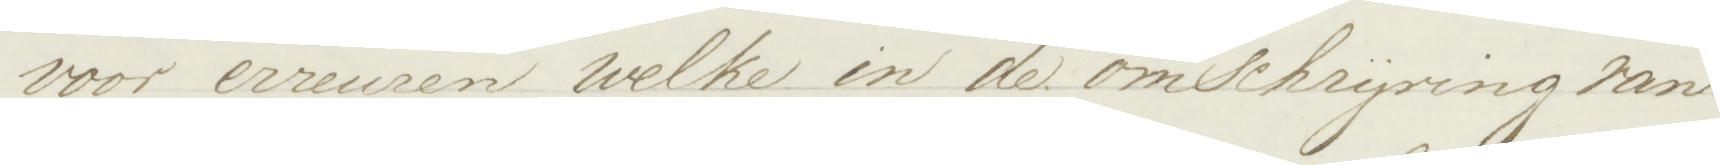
voor erreuren, welke in de omschrijving van
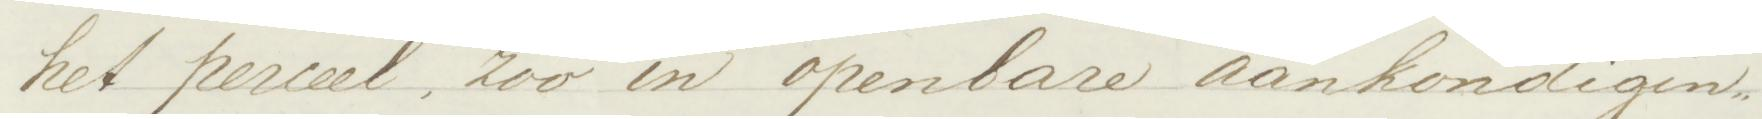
het perceel, zoo in openbare aankondigin„
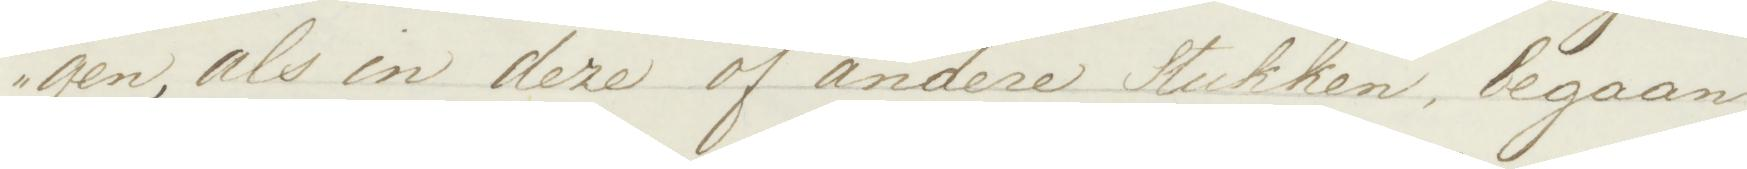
„gen, als in deze of andere stukken, begaan
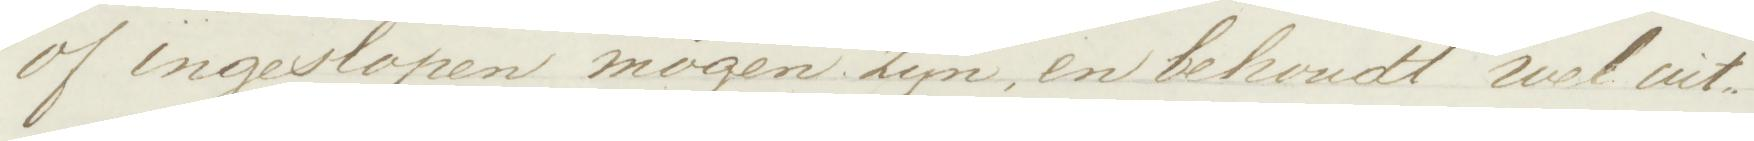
of ingeslopen mogen zijn, en behoudt wel uit„
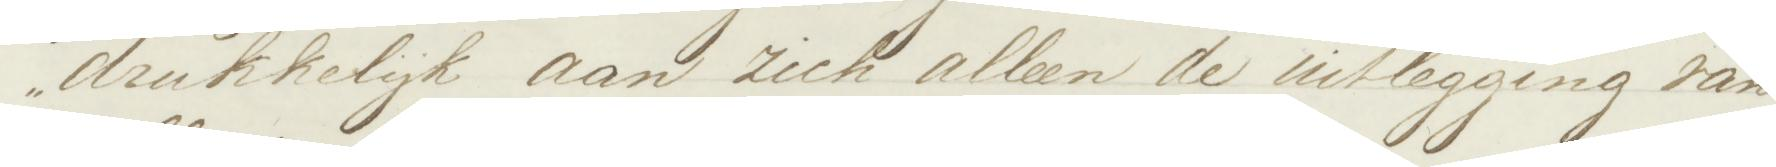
„drukkelijk aan zich alleen de uitlegging van
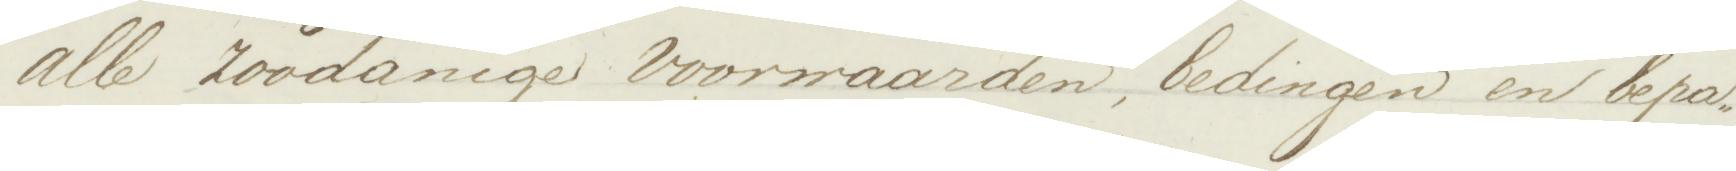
alle zoodanige voorwaarden, bedingen en bepa„
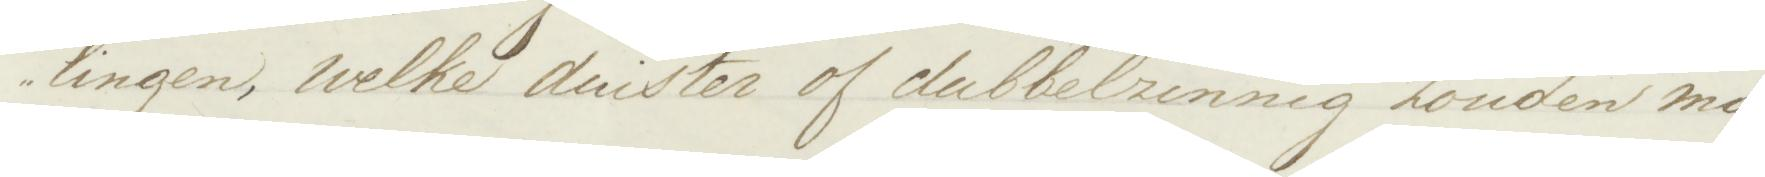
„lingen, welke duister of dubbelzinnig zouden mo
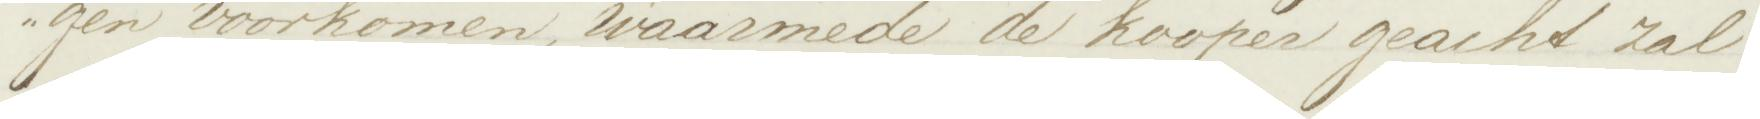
„gen voorkomen, waarmede de kooper geacht zal
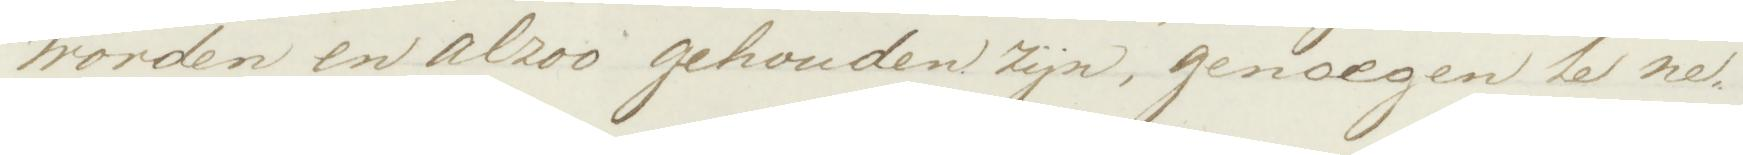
worden en alzoo gehouden zijn, genoegen te ne„
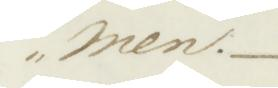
„men. —
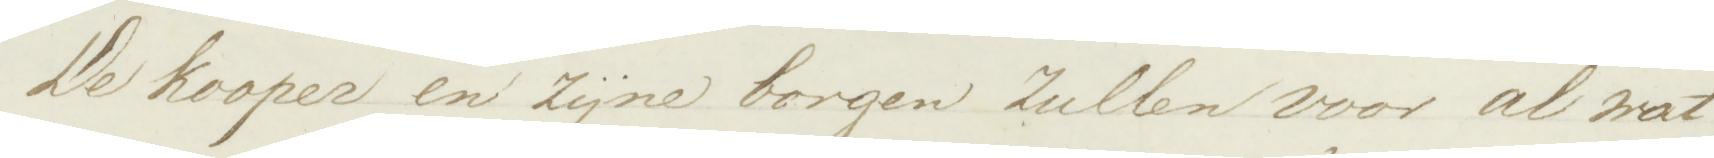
De kooper en zijne borgen zullen voor al wat
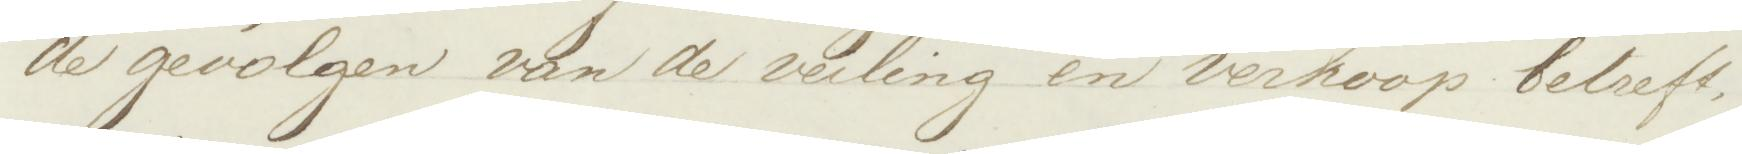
de gevolgen van de veiling en verkoop betreft,
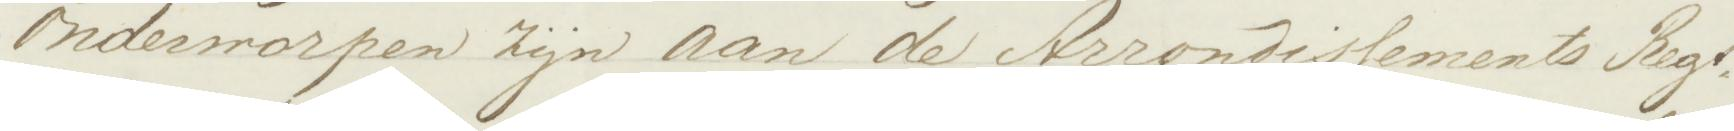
Onderworpen zijn aan de Arrondissements Regt„
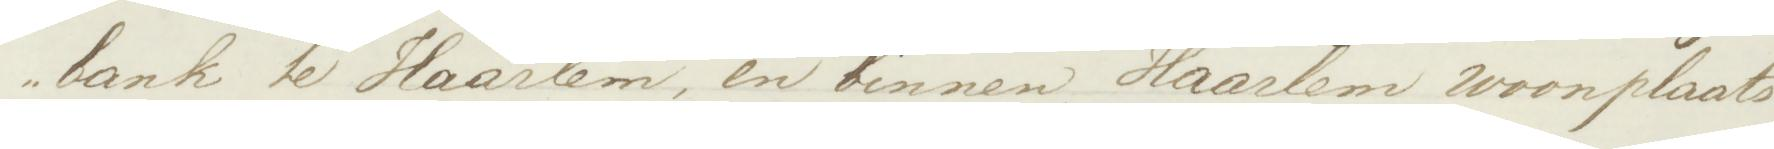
„bank te Haarlem, en binnen Haarlem woonplaats
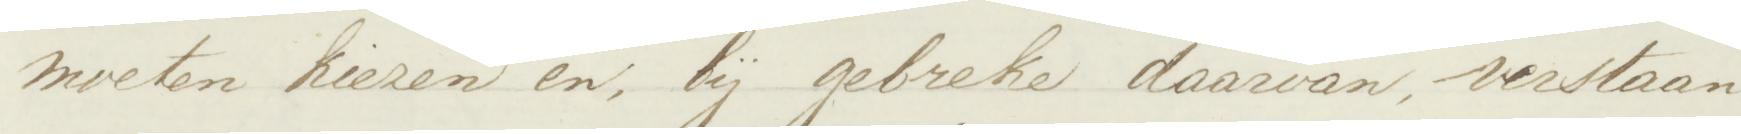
moeten kiezen en, bij gebreke daarvan, verstaan
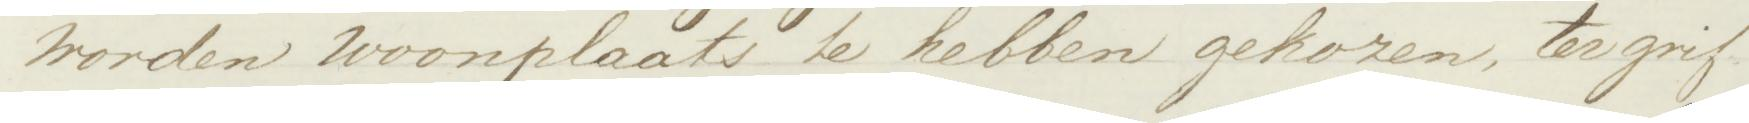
worden woonplaats te hebben gekozen, ter grif
